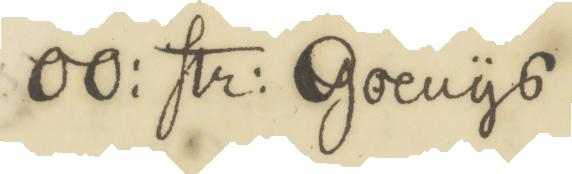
00: str: Goenijs
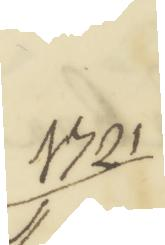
1721„
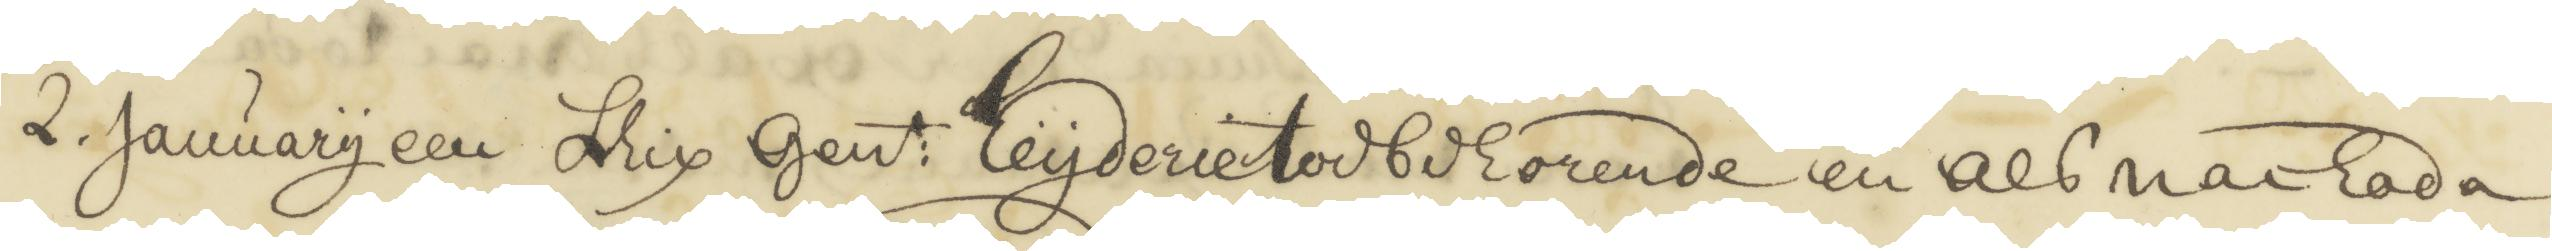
2. Januarij een schip Gen:t heijderie toebehorende en als nachoda
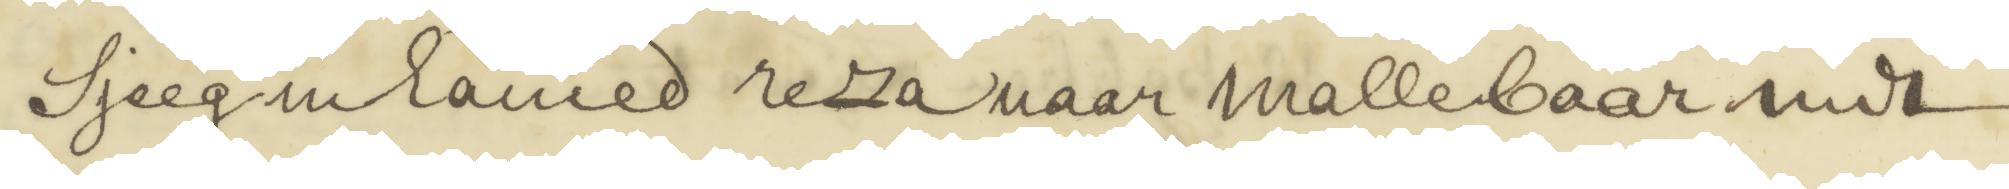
Sjeeg in hamed reza naar mallebaar met
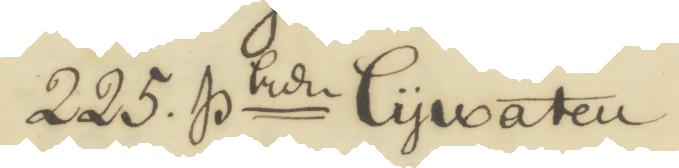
225. p=ken lijwaten
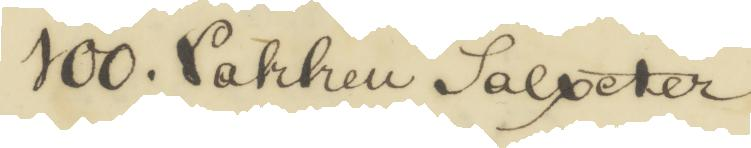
100. Sakken salpeter
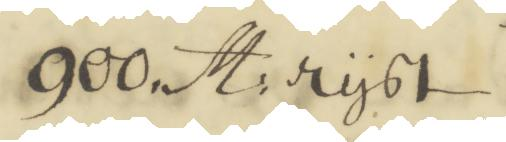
900. M: rijst
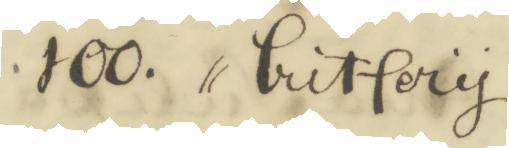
100. „ kitserij
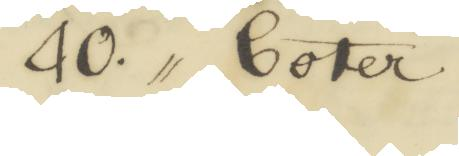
40. „ boter
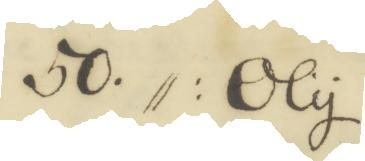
50. „: Olij
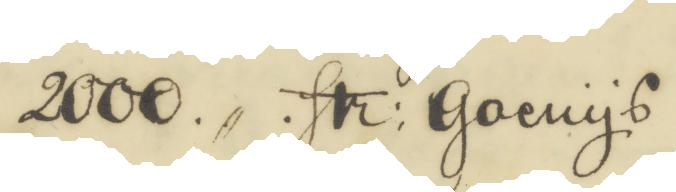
2000. „ str: Goenijs
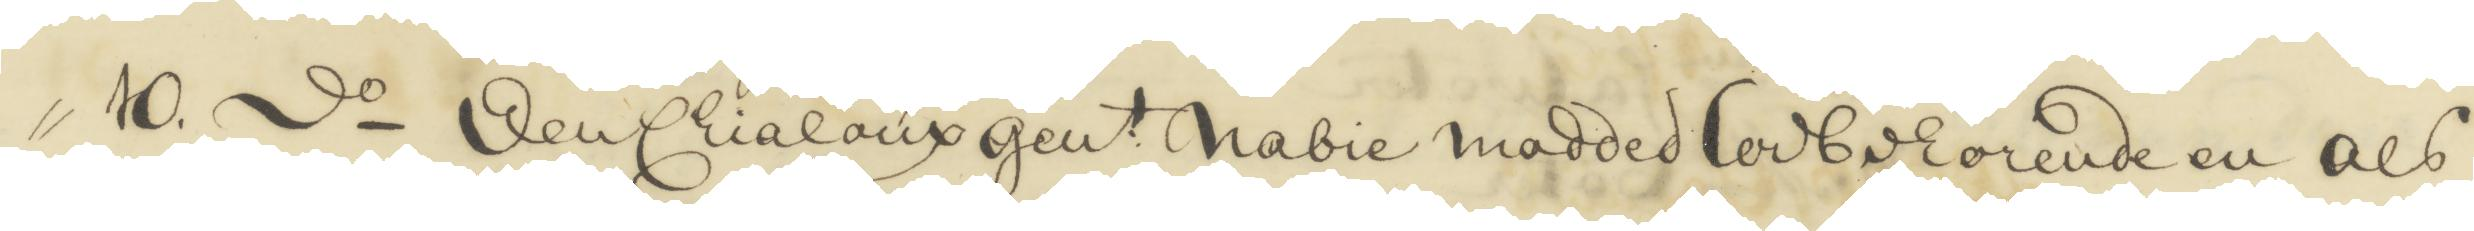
„ 10. D=o Een Chialoup gen:t nabie madded toebehorende en als
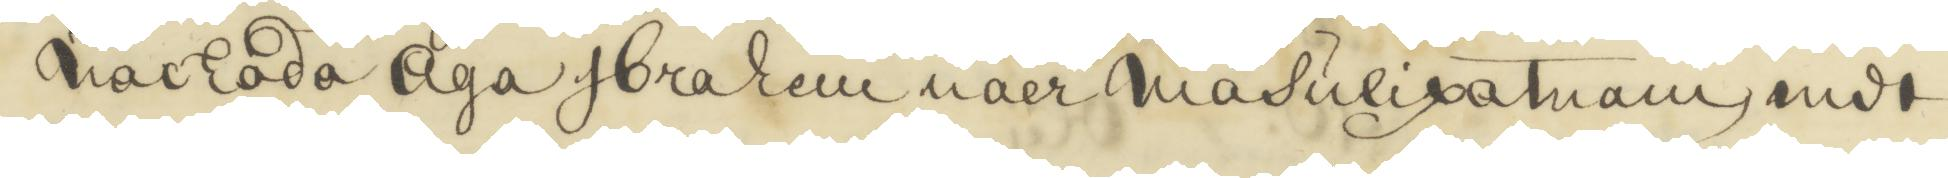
nachoda Aga jbrahem naer masulipatnam, met
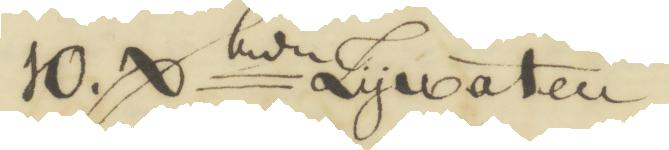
10. p=ken Lijwaten
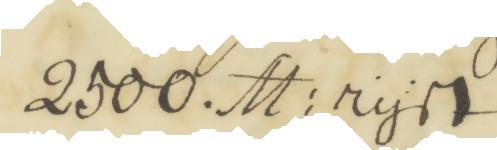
2500. M: rijst
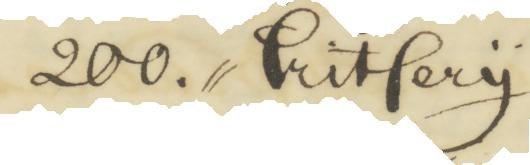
200. „ kitserij
